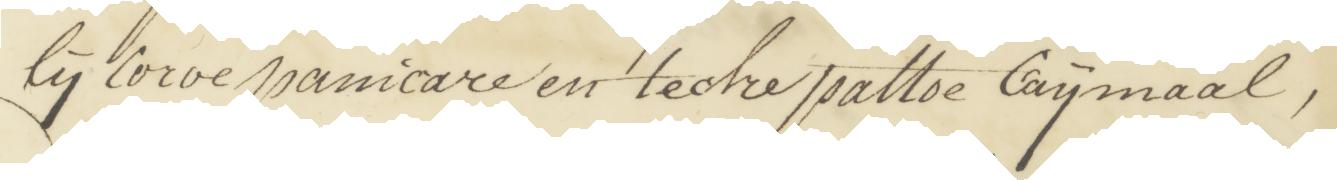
lij coroe panicare en tecke pattoe Caijmaal,
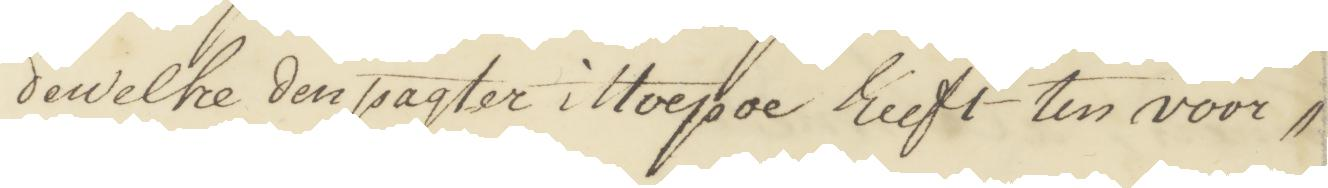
dewelke den pagter ittoepoe heeft ten voor„
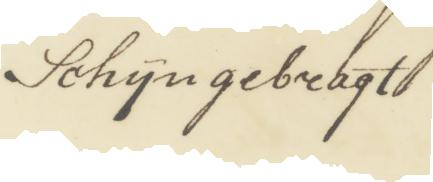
schijn gebragt
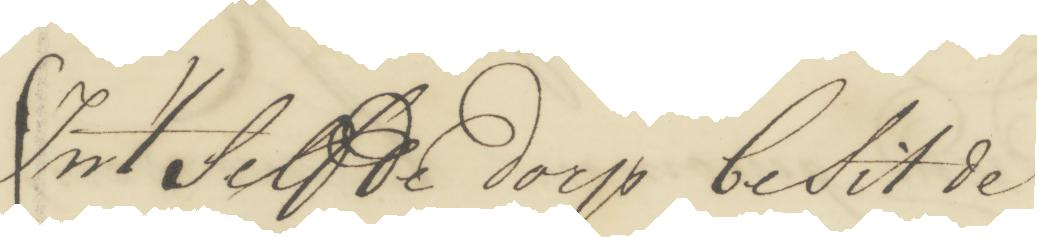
In 't selfde dorp besit de
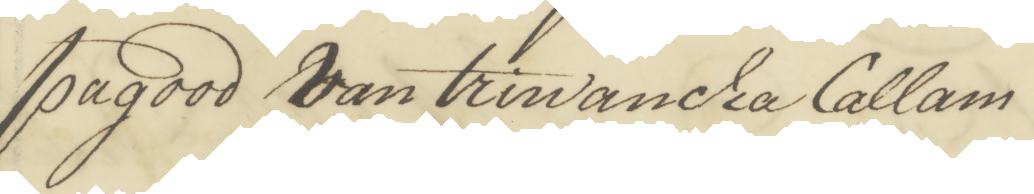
pagood van triwancha Callam
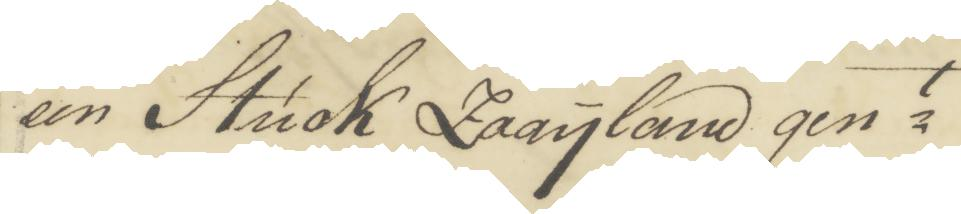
een stuck zaaijland gen=t
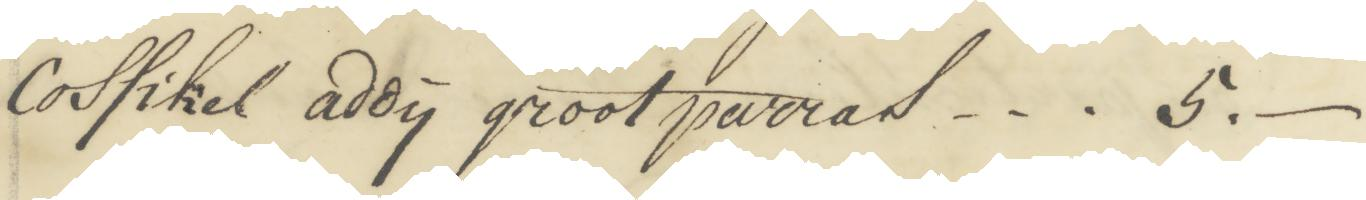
Cossikel addij groot parras - - . 5. —
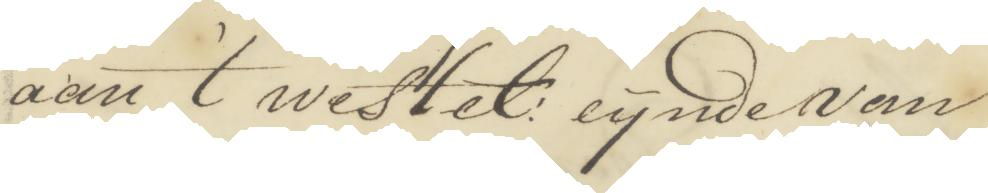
aan ’t westel: eijnde van
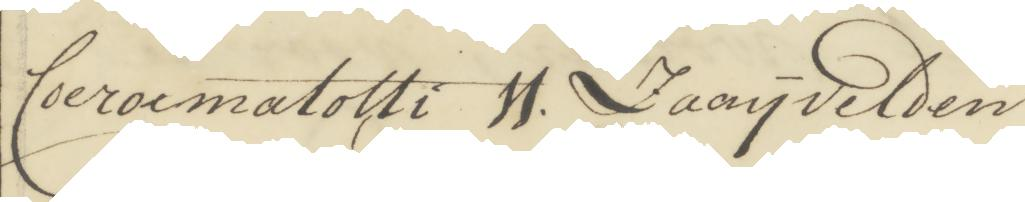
Coeroematotti 11. zaaij velden
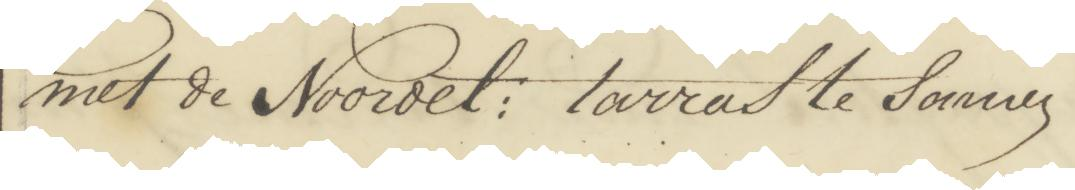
met de Noordel: tarras te Saray
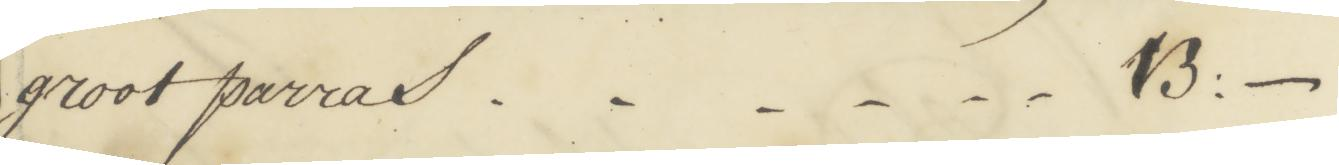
groot parras - - - - - - 13: —
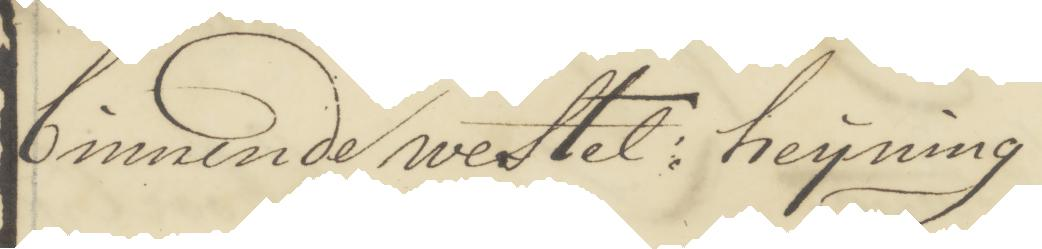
binnen de westel: heijning
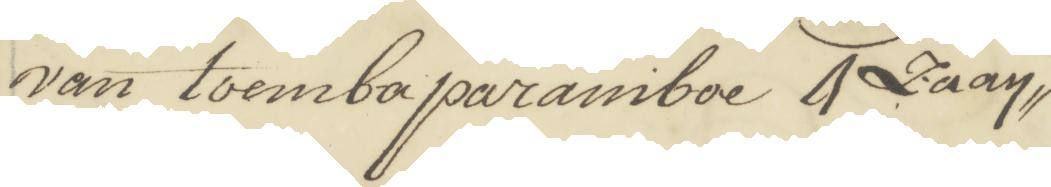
van toemba paraniboe 4 zaaij„
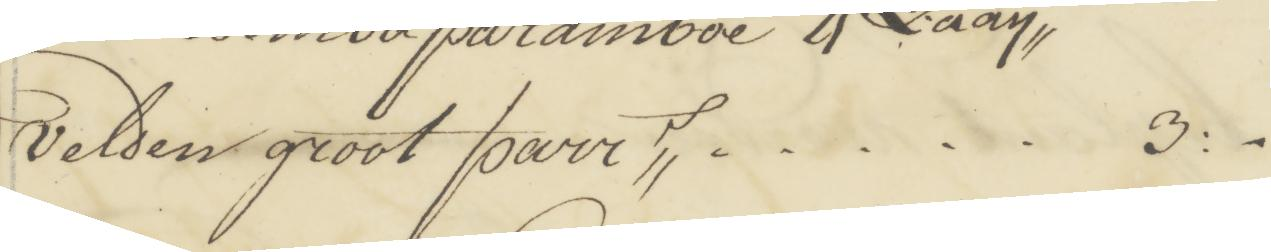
velden groot parr„s - - - - - 3: —
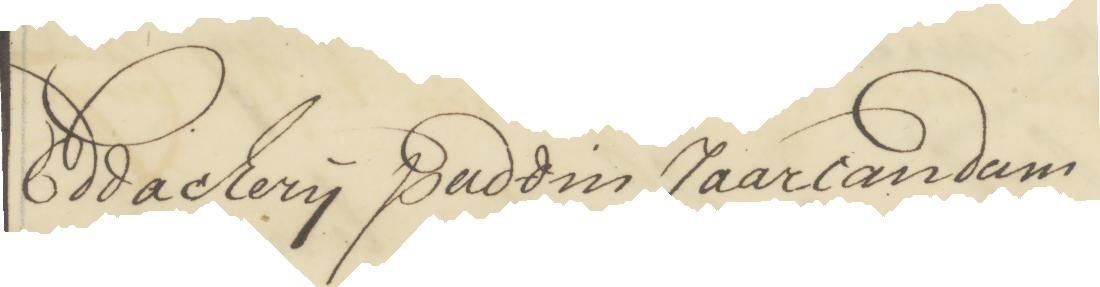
Eddacherij paddin Jaarcandam
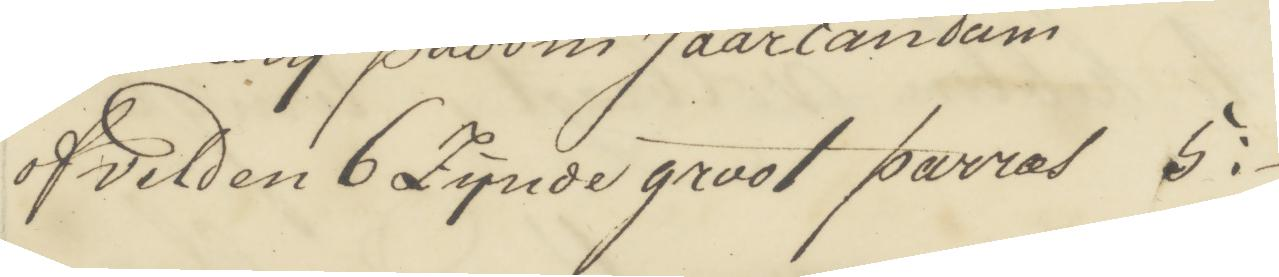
of velden 6 zijnde groot parras 5:-
